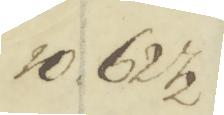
10„62½
